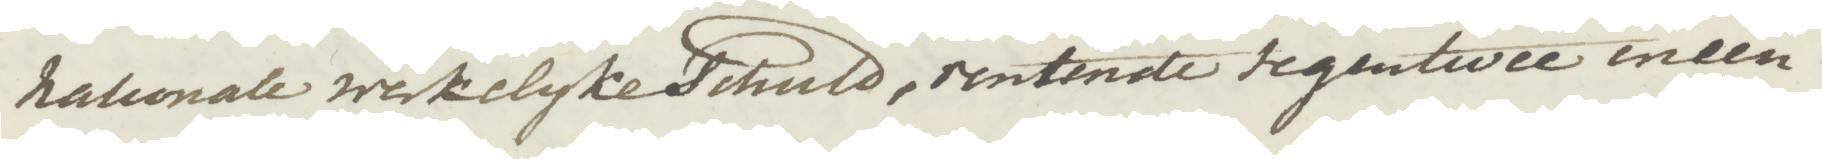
nationale werkelijke schuld, rentende tegen twee en een
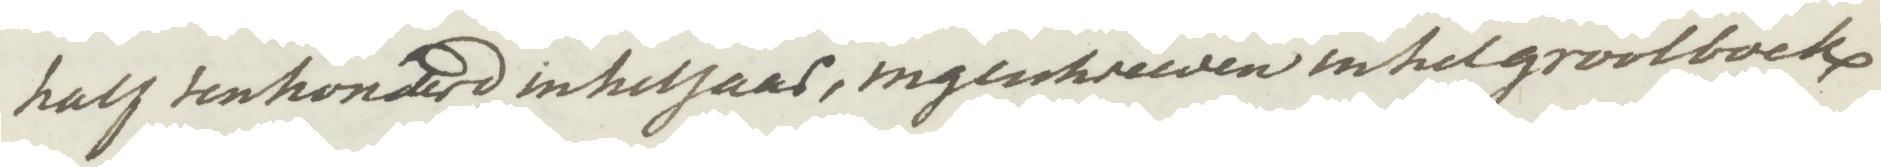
half ten honderd in het jaar, ingeschreeven in het grootboek
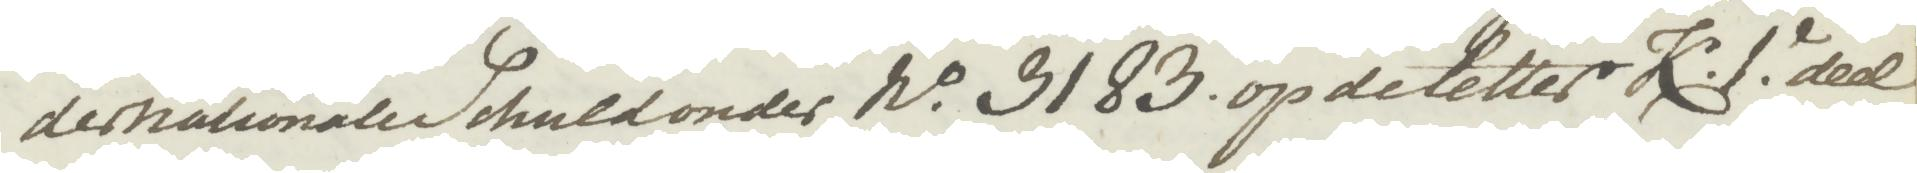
des nationale Schuld onder N.o 3183. op de letter K.1.e deel
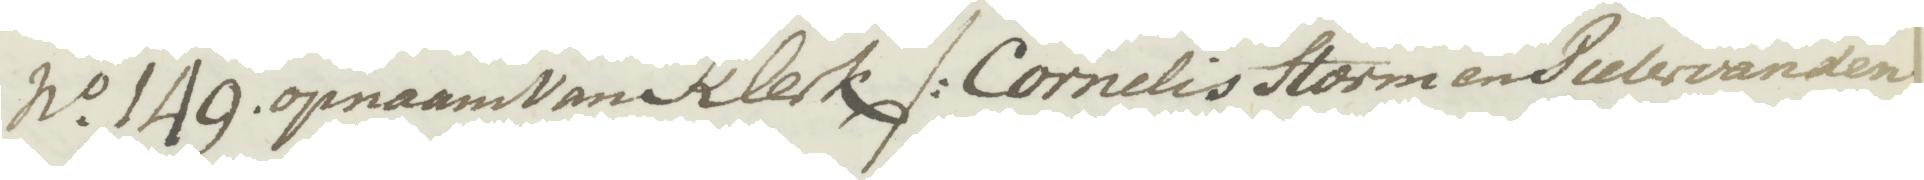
n.o 149. op naam van Klerk /: Cornelis Storm en Pieter van den
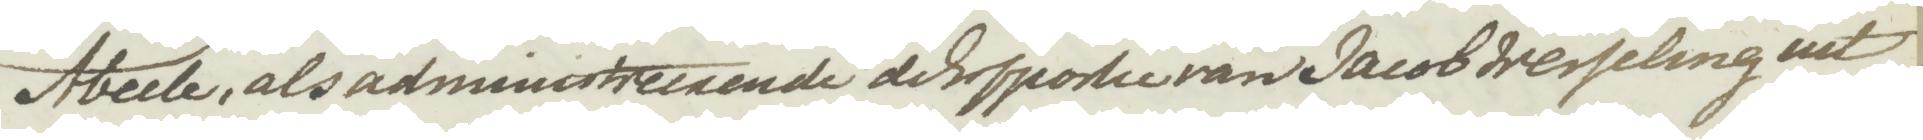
Abeele, als administreerende de Erfportie van Jacob Wesseling uit
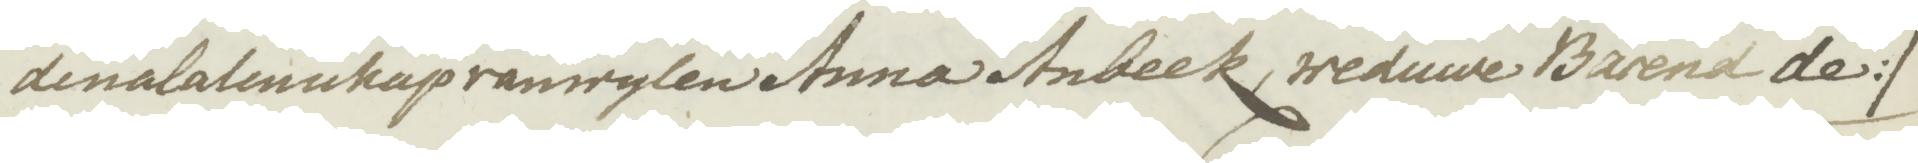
de nalatenschap van wylen Anna Anbeek, weduwe Barend de :/
